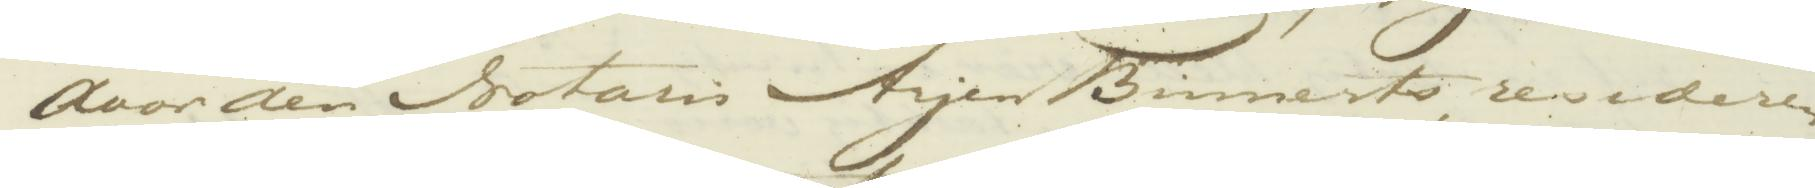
door den Notaris Arjen Binnerts, resideren
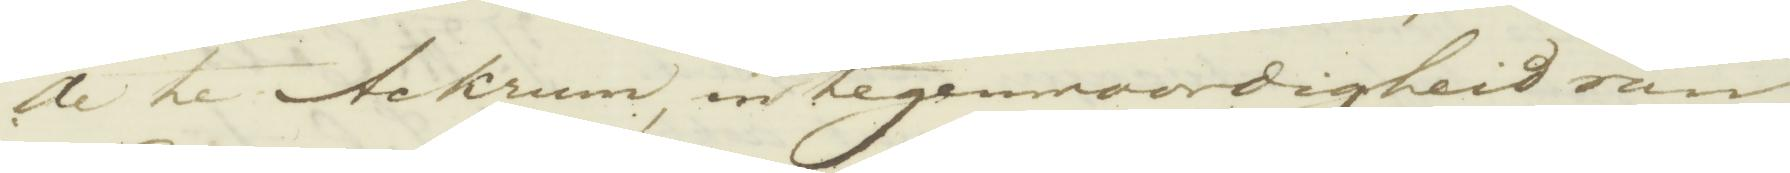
de te Ackrum, in tegenwoordigheid van
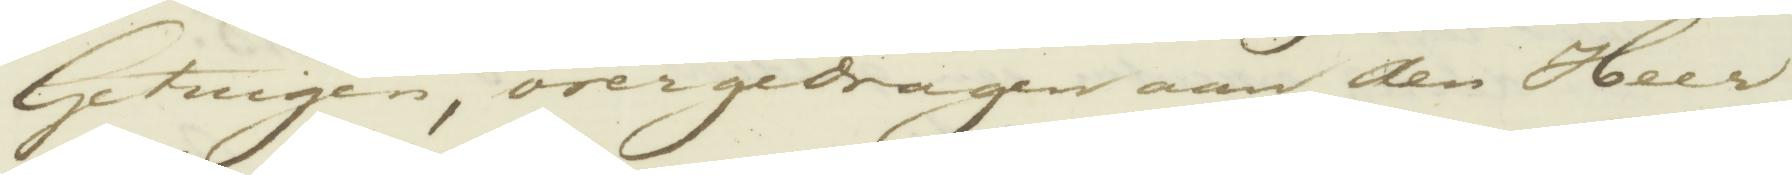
Getuigen, overgedragen aan den Heer
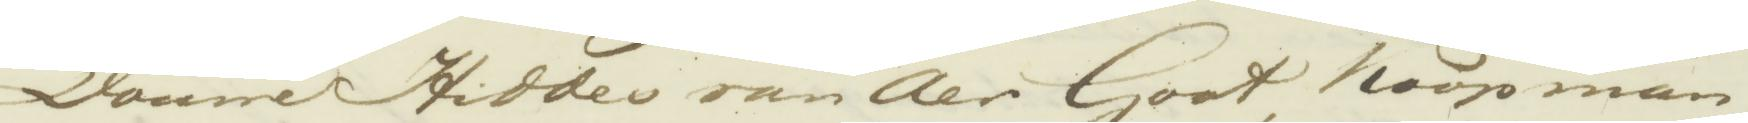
Douwe Hiddes van der Goot, Koopman
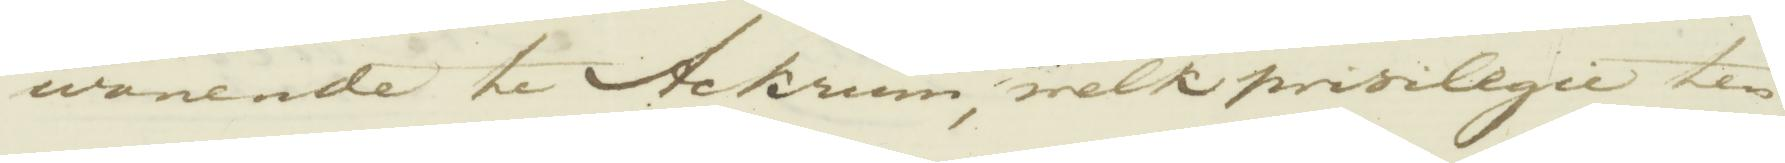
wonende te Ackrum, welk privilegie ten
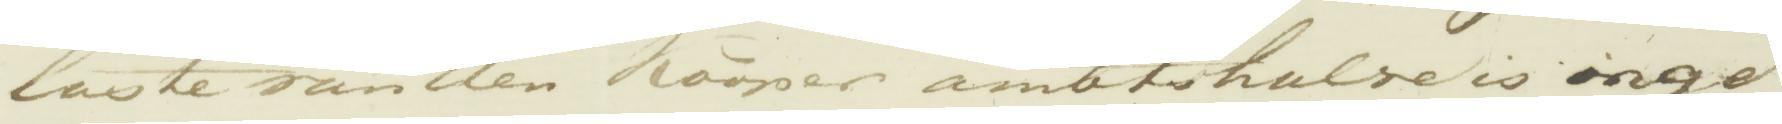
laste van den Kooper ambtshalve is inge
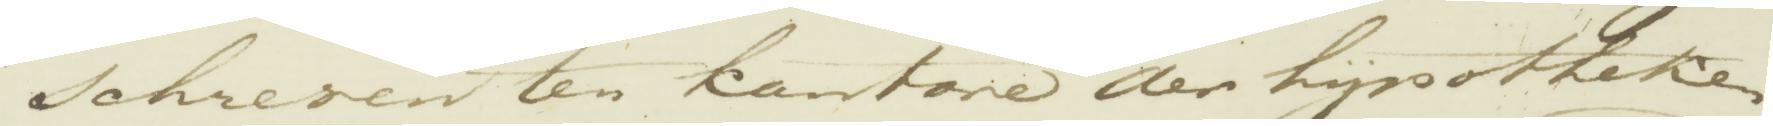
schreven ten kantore der hijpotheken
